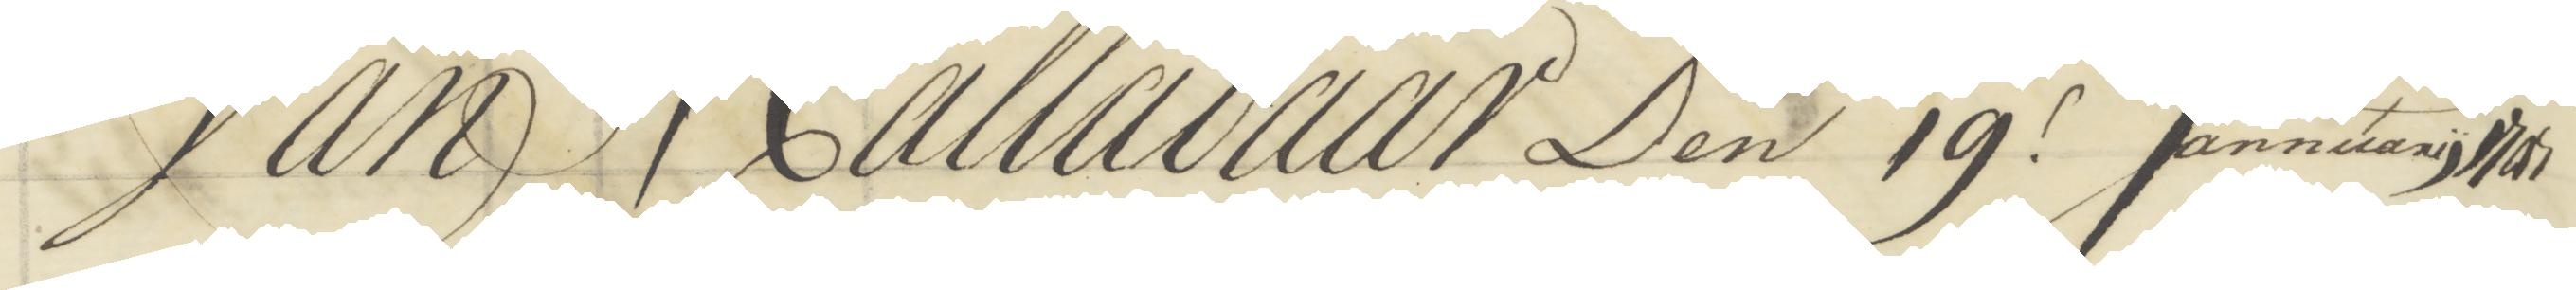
Van Mallabaar Den 19.' Jannuarij 1747
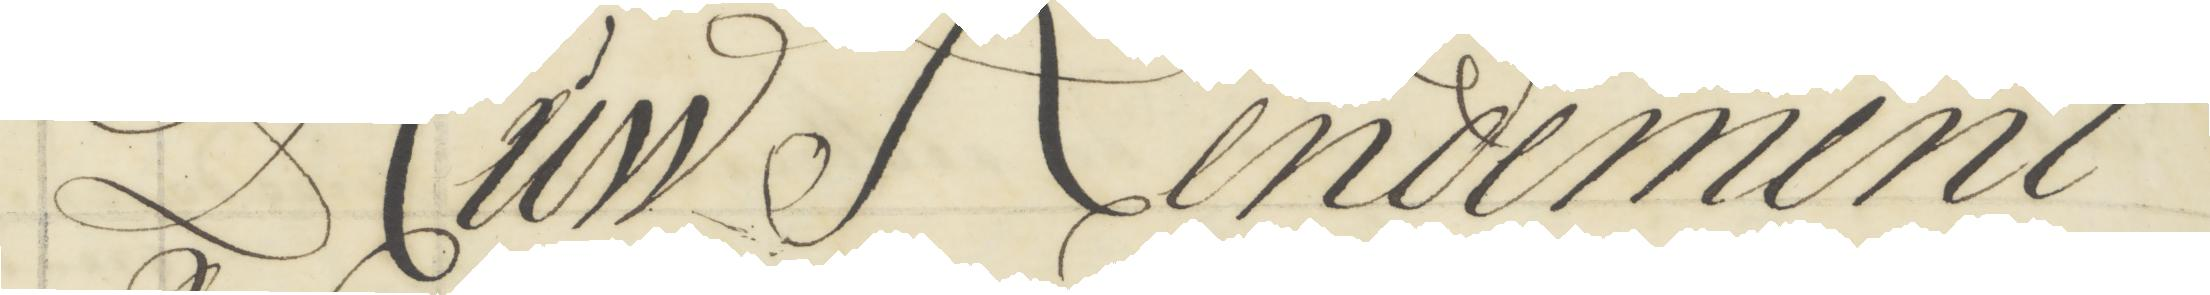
Ruw Rendement
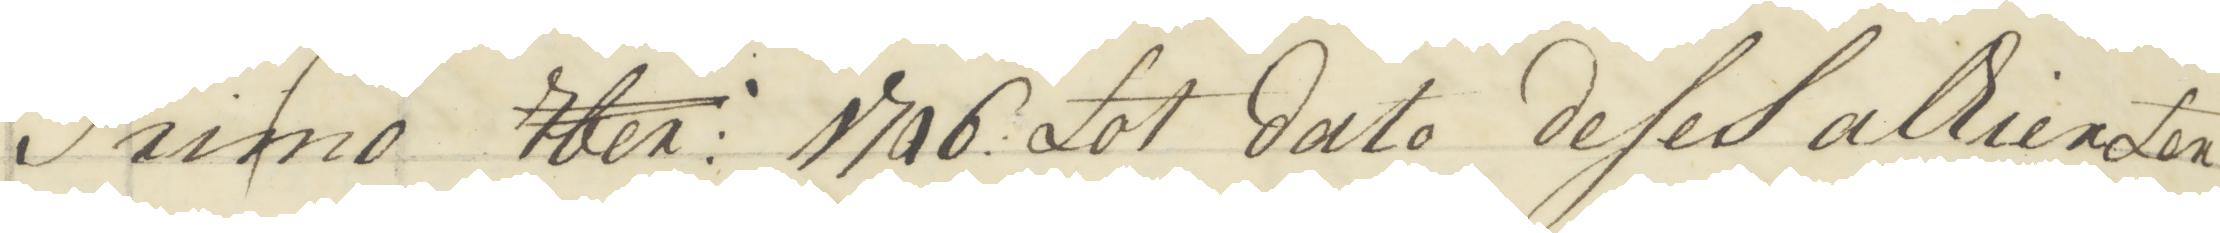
Primo 7ber: 1746: tot dato deses alhier ter
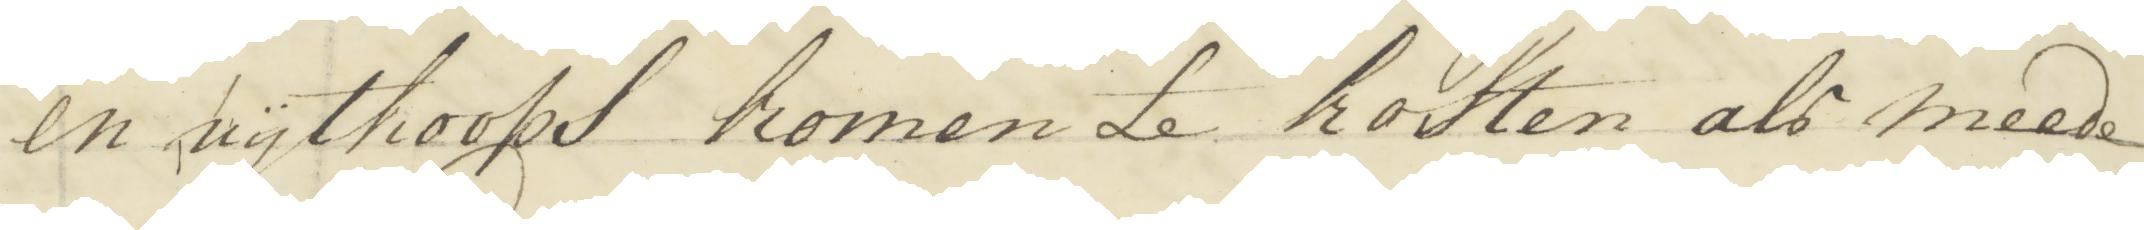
en uijtkoops komen te kosten als meede
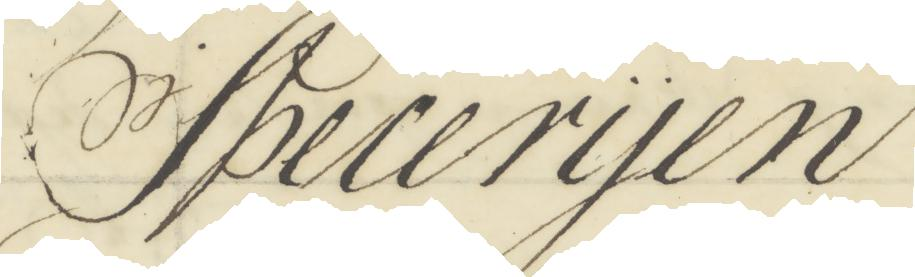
Specerijen
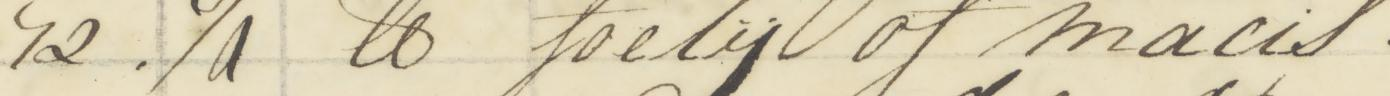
72. 3/4 lb foelij of macis
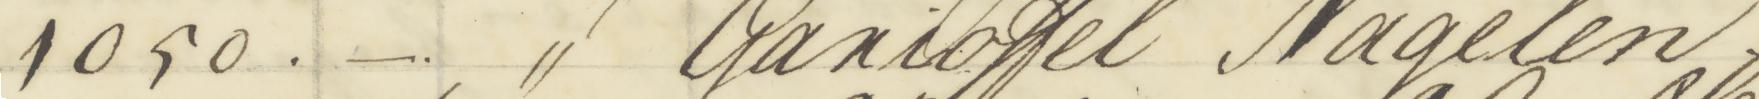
1050. —. „ Garioffel Nagelen
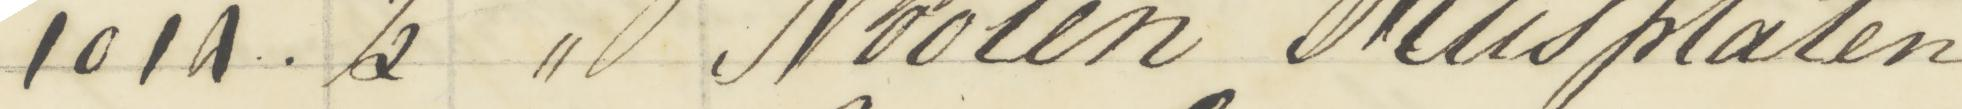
1014. ½ „ Nooten Musschaten
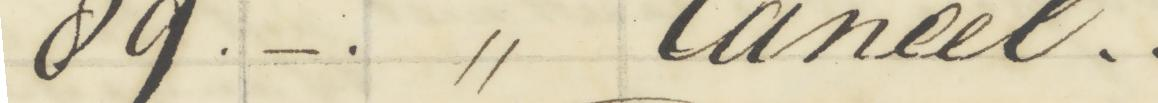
89. —. „ Caneel
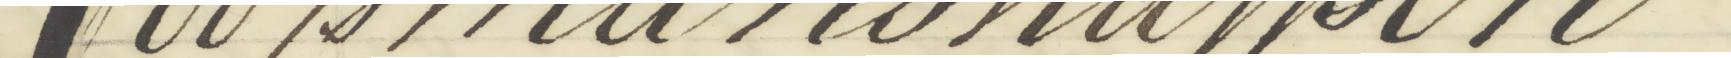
Coopmanschappen
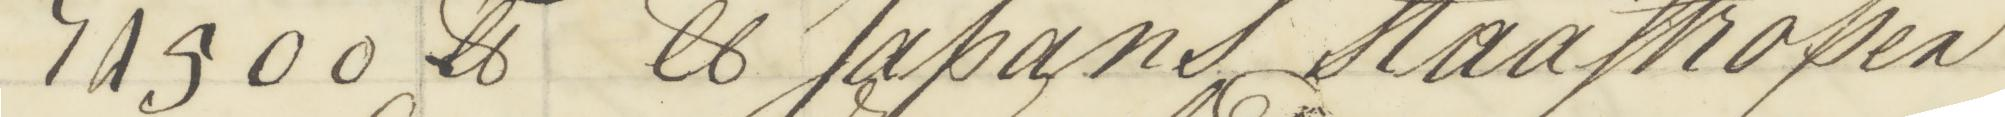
74500 lb lb Japans staafkoper
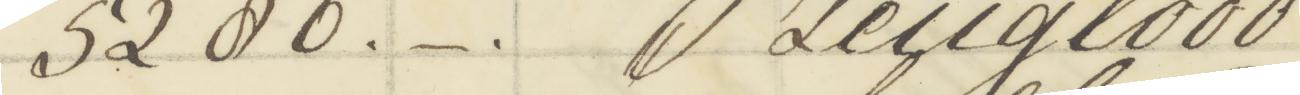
5286. —. „ zeuglood
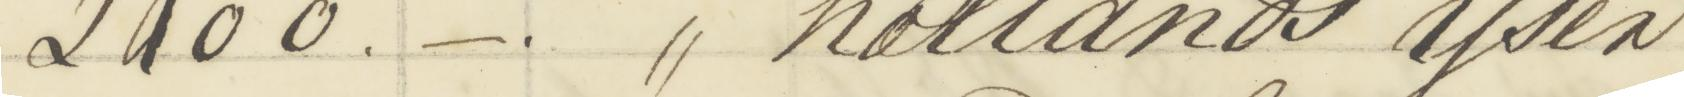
2400. —. „ hollands ijser
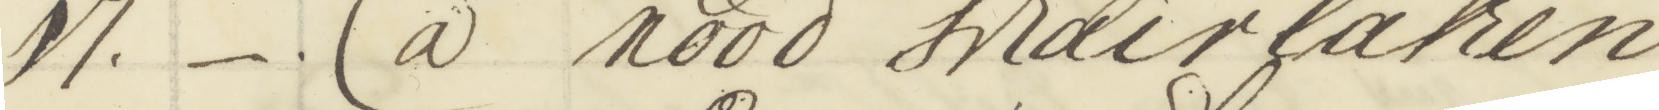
17. —. @ rood schairlaken
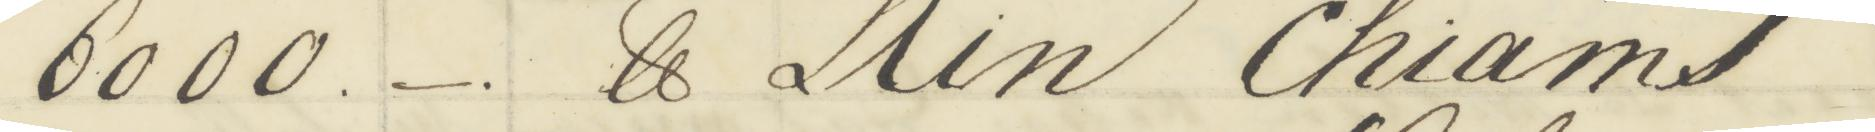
6000. —. lb thin chiams
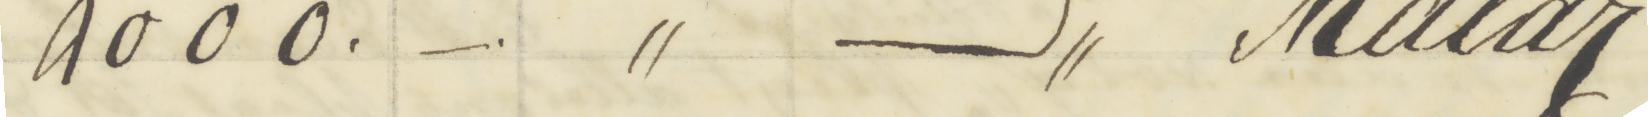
4000. —. „ _„o Malax
